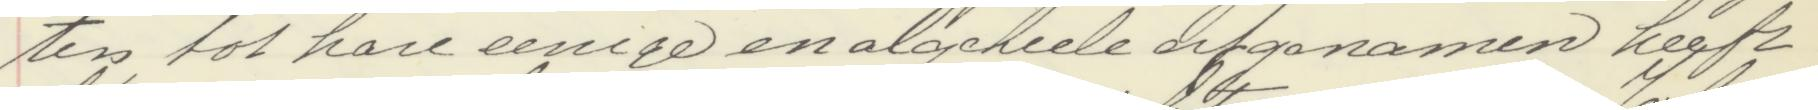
en, tot hare eenige en algeheele erfgenamen heeft
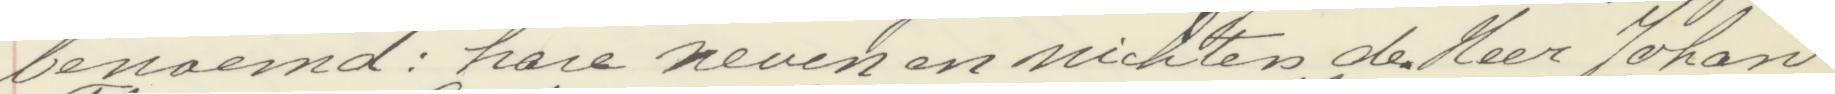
benoemd: hare neven en nichten, de Heer Johan
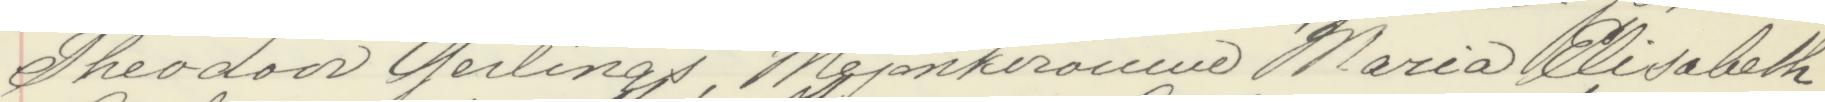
Theodoor Gerlings, Mejonkvrouwe Maria Elisabeth
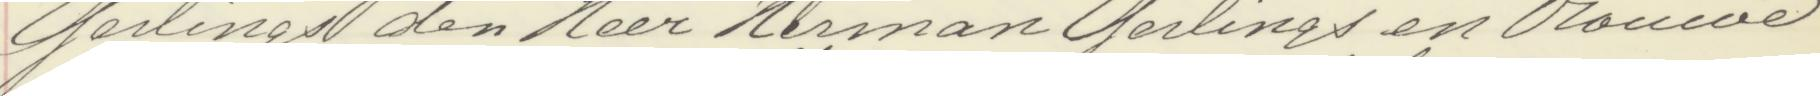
Gerlings, den Heer Herman Gerlings en Vrouwe
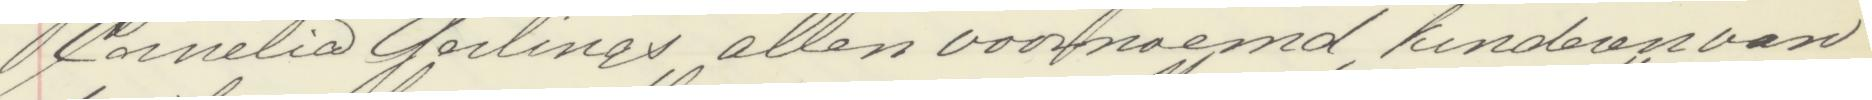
Cornelia Gerlings, allen voornoemd kinderen van
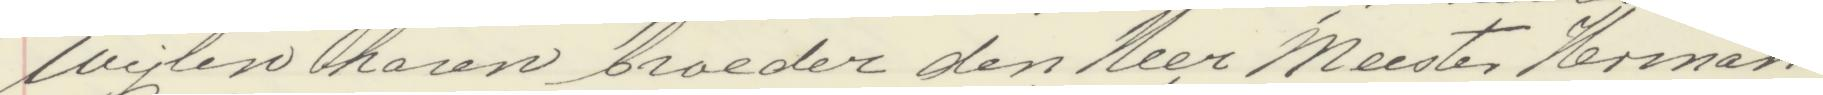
wijlen haren broeder den Heer Meester Herman
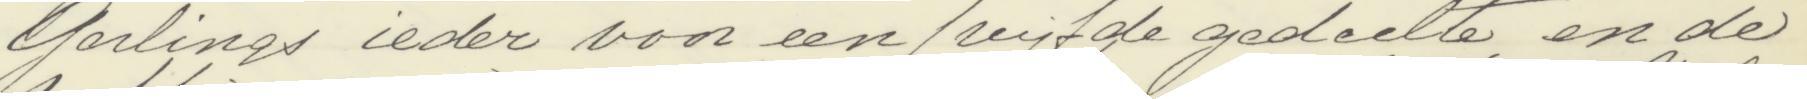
Gerlings ieder voor een/vijfde gedeelte, en de
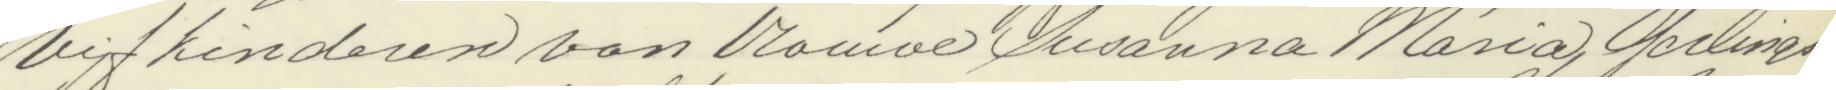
vijf kinderen van Vrouwe Susanna Maria Gerlings
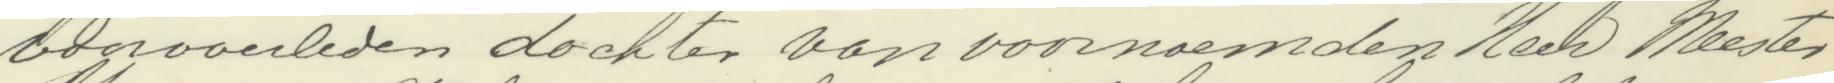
vooroverleden dochter van voornoemden Heer Meester
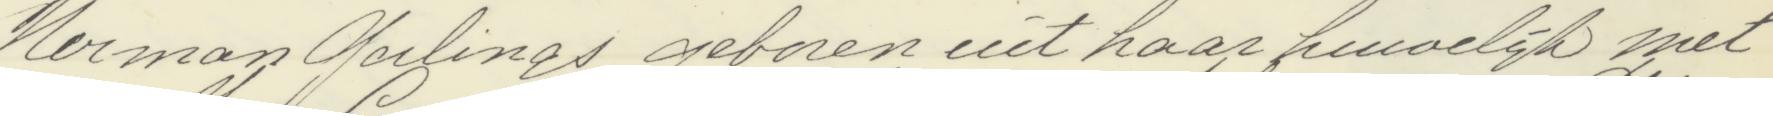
Herman Gerlings, geboren uit haar huwelijk met
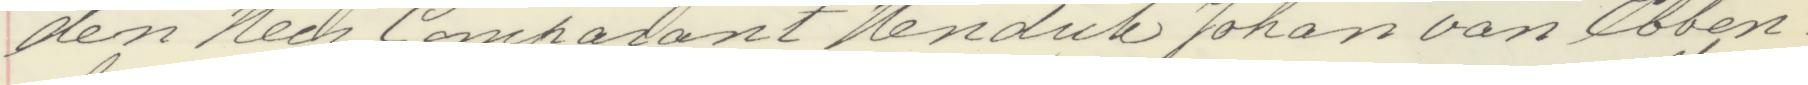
den Heer Comparant Hendrik Johan van Ebben
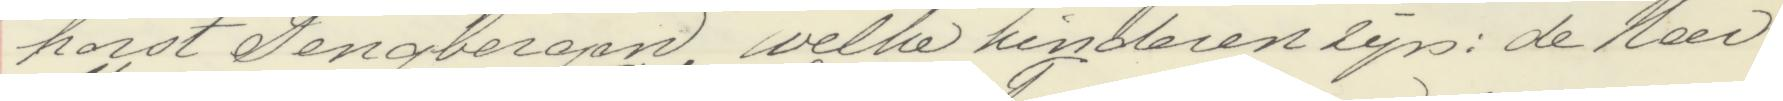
horst Tengbergen, welke kinderen zijn: de Heer
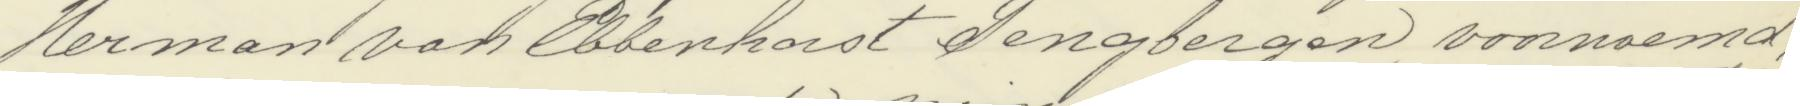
Herman van Ebbenhorst Tengbergen, voornoemd,
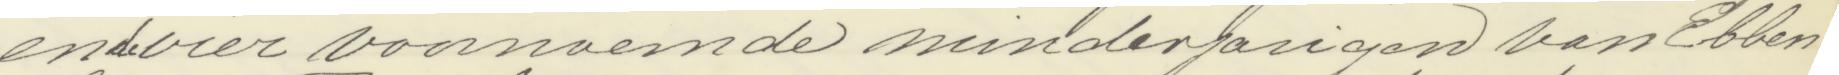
en de vier voornoemde minderjarigen van Ebben-
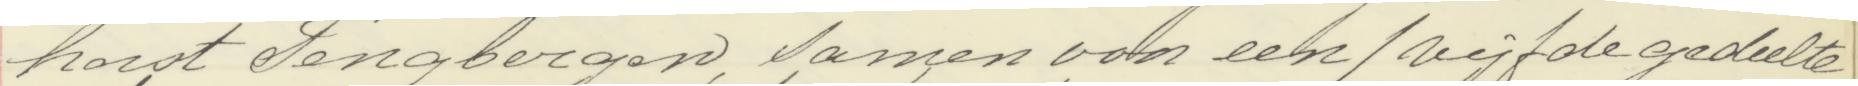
horst Tengbergen, samen voor een/vijfde gedeelte
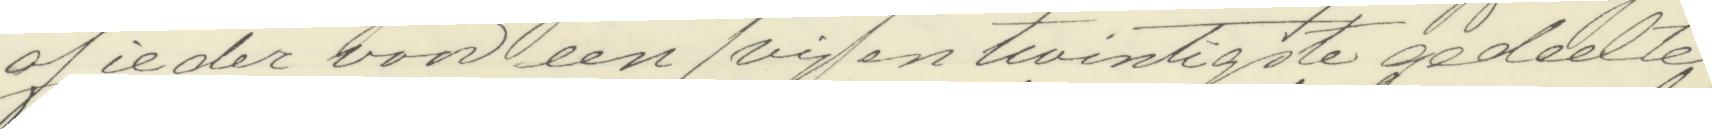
of ieder voor een/vijf en twintigste gedeelte
